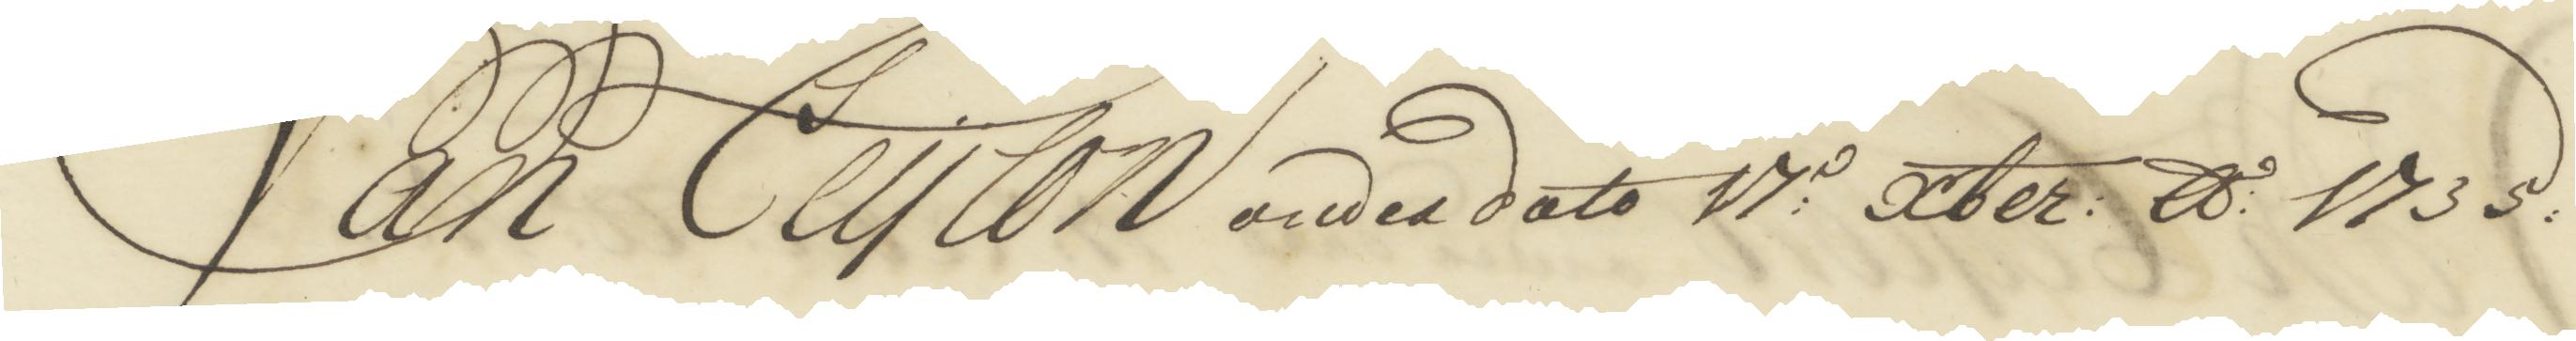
Van Ceijlon onder dato 17:e xber: A:o 1735 :
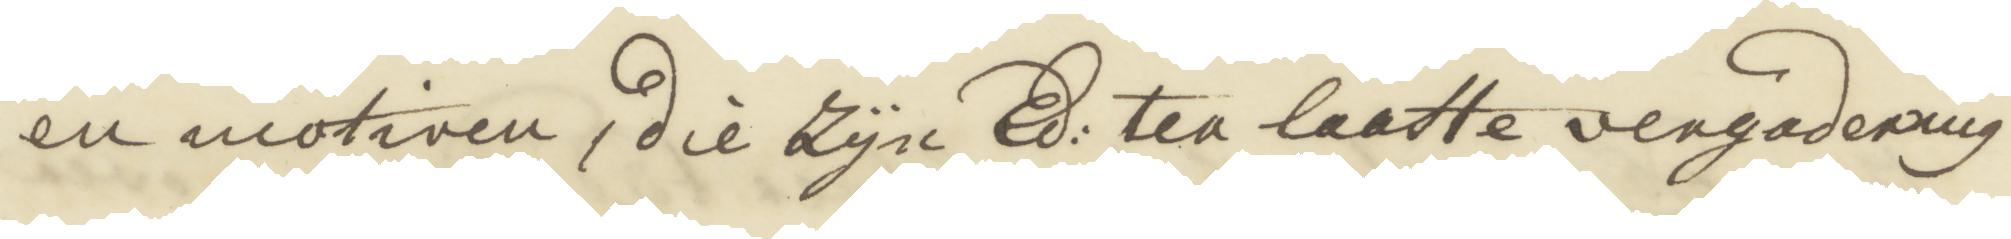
en motiven, die Zijn Ed: ter laaste vergadering
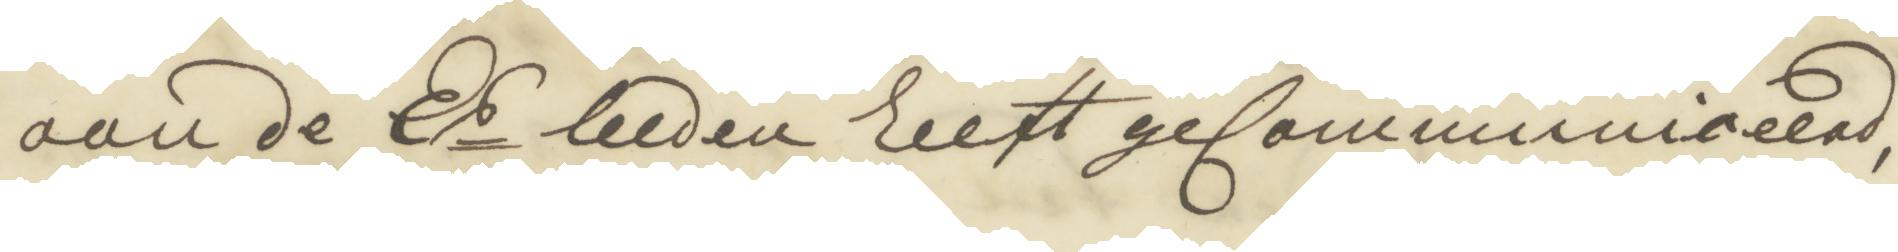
aan de E=s leeden heeft gecommuniceerd,
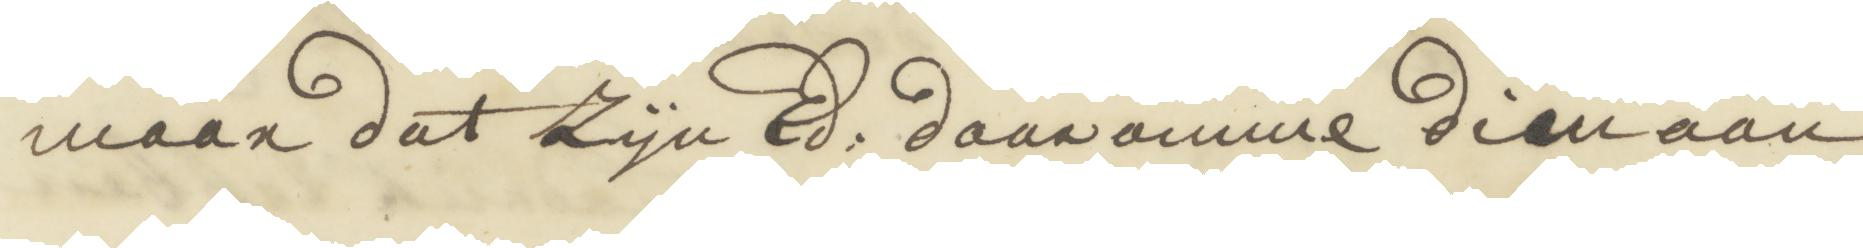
maar dat Zijn Ed. daaromme dien aan
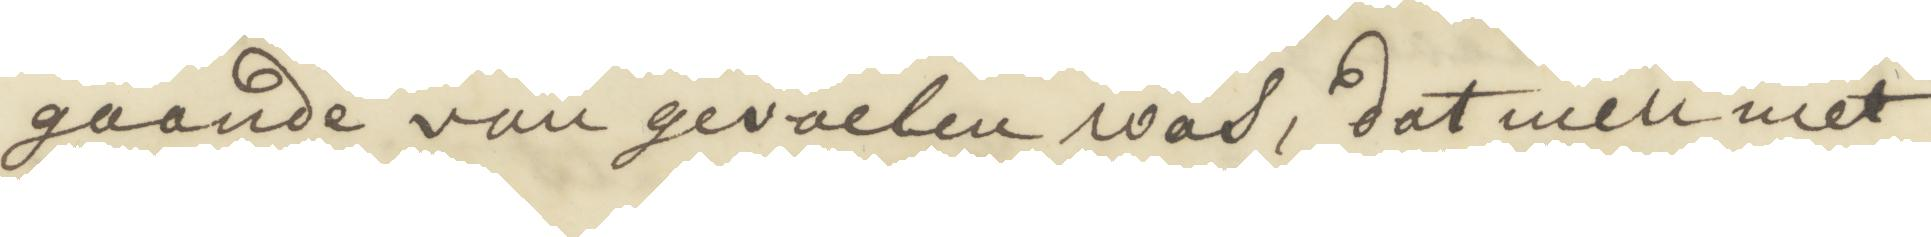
gaande van gevoelen was, dat men met
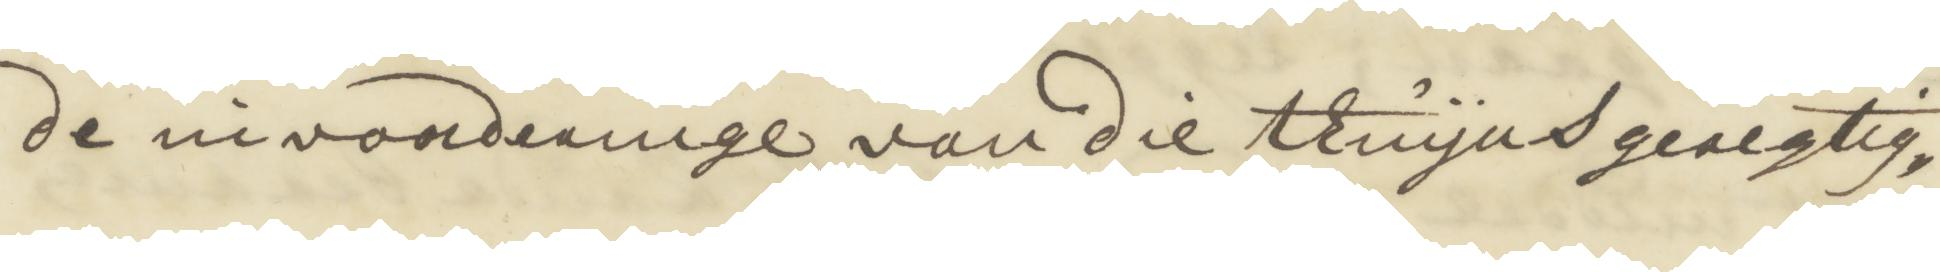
de invorderinge van die thuijns geregtig„
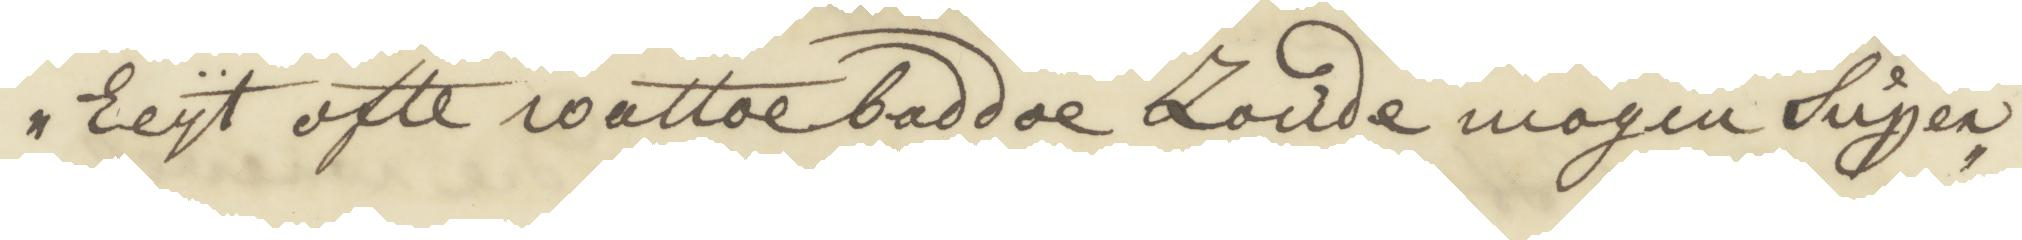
„heijt ofte wattoebaddoe Zoude mogen Super„
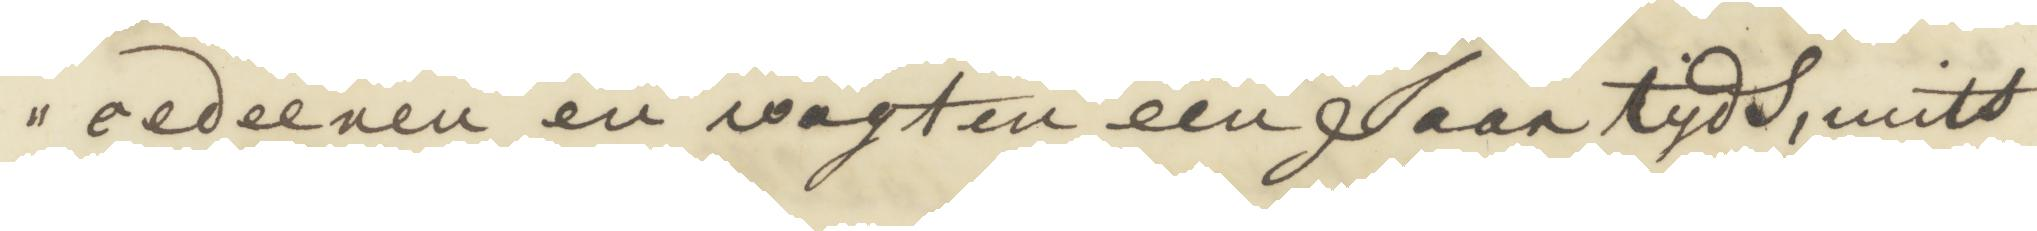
„cedeeren en wagten een Jaar tijds, mits
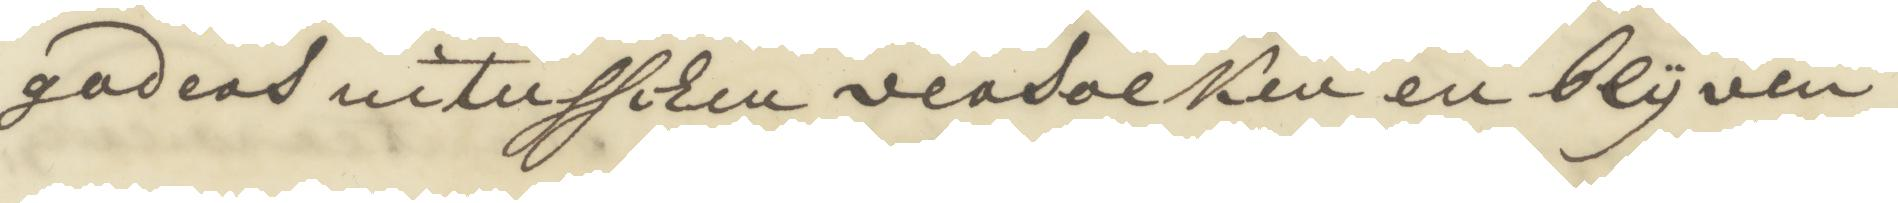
gaders intusschen versoeken en blijven
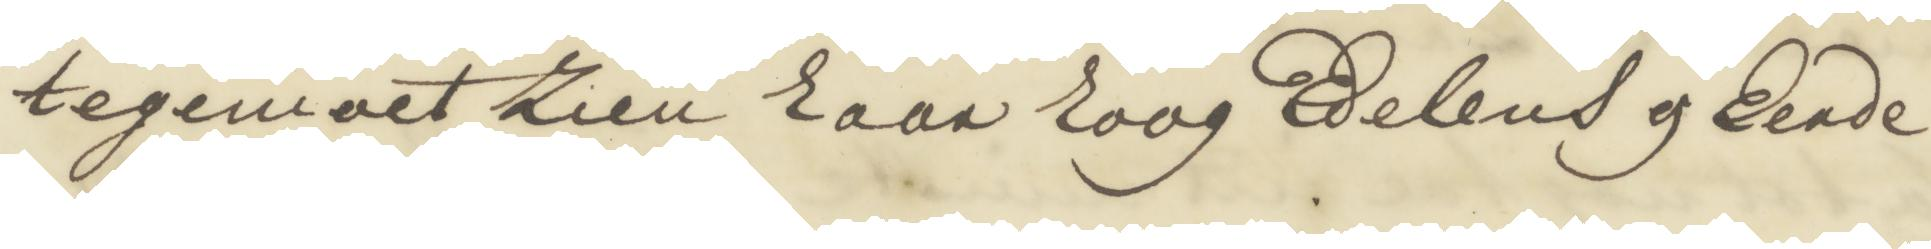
tegemoet Zien haar hoog Edelens g’Eerde
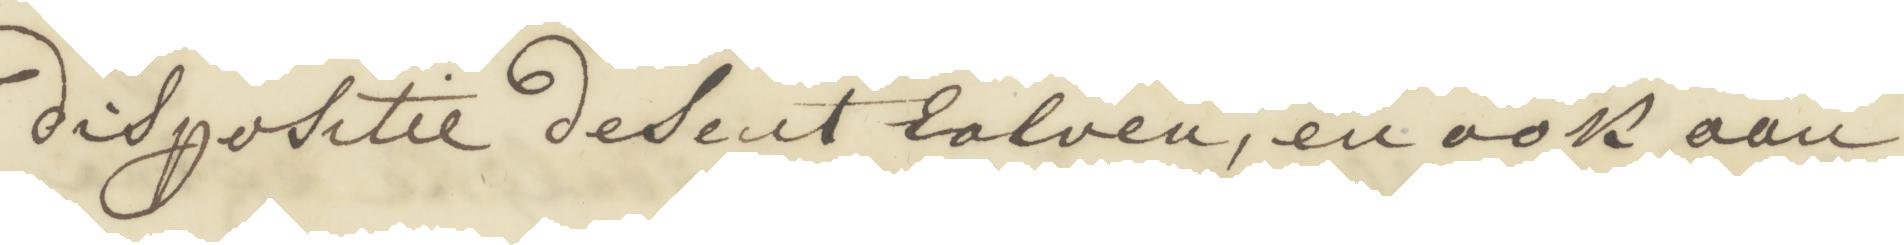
dispositie desent halven, en ook aan
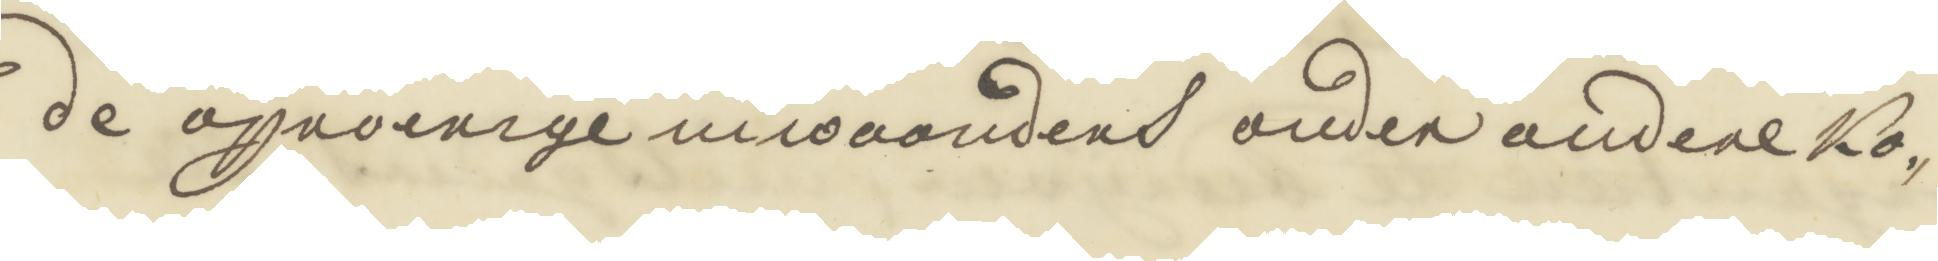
de oproerige inwoonders onder andere Ko„
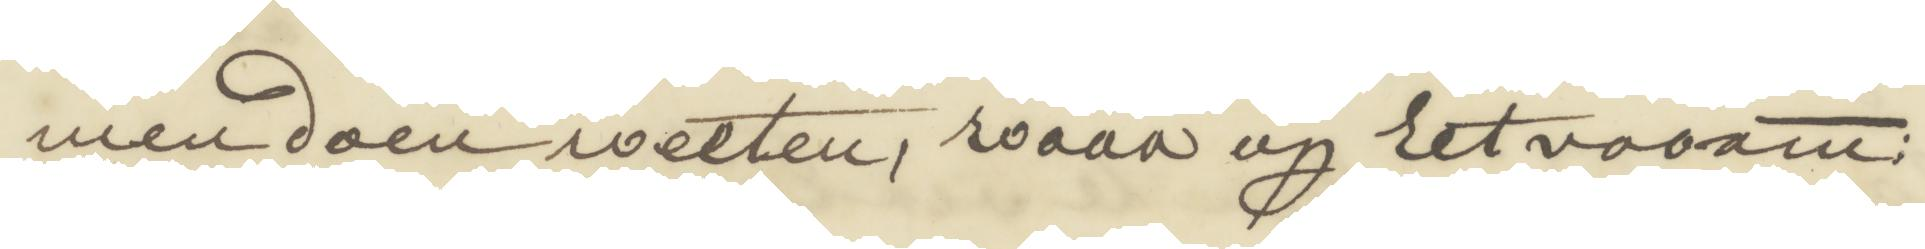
men doen weeten, waar op het voorm:
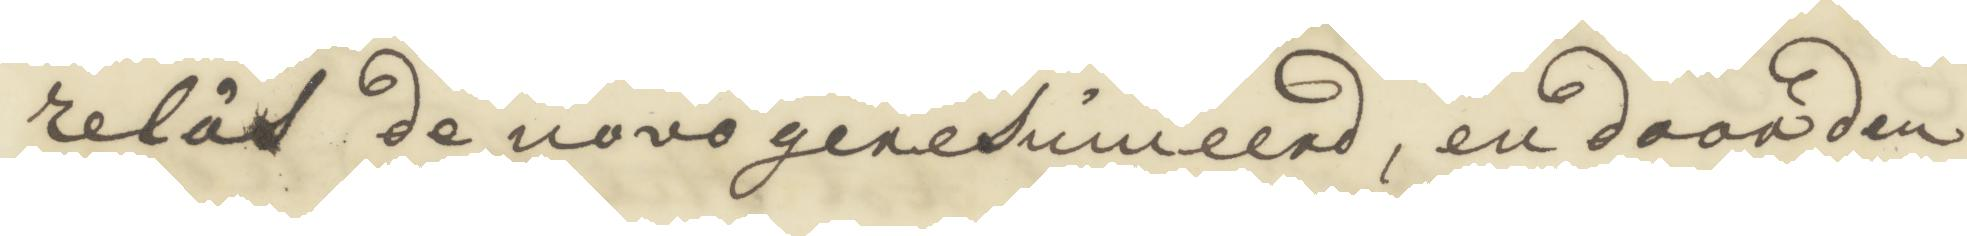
relas de novo geresumeerd, en door den
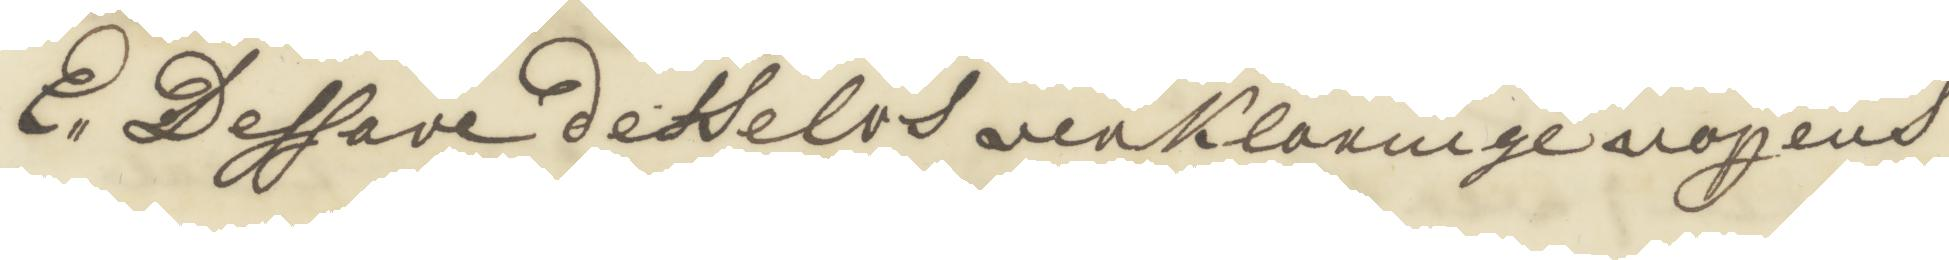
E„ Dessave desselvs verklaringe nopens
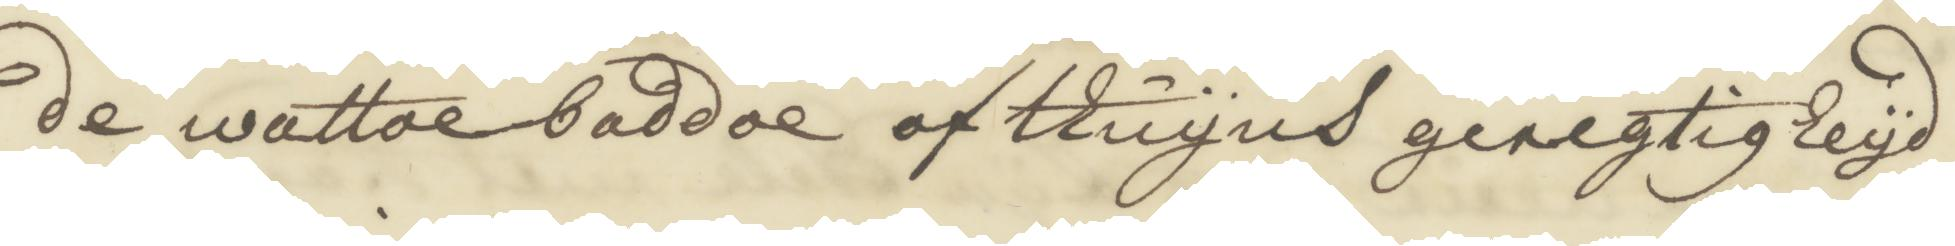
de wattoe baddoe of thuijns geregtigheijd
